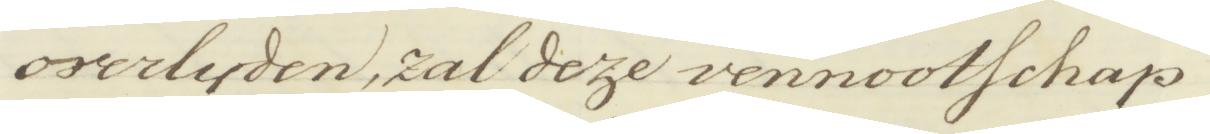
overlyden, zal deze vennootschap
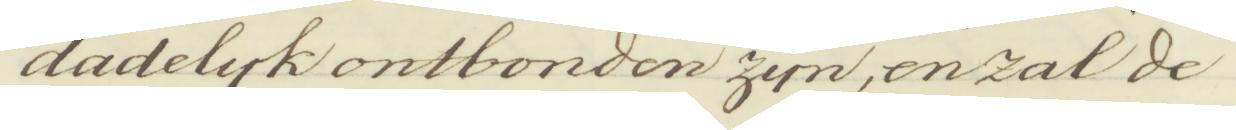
dadelyk ontbonden zyn, en zal de
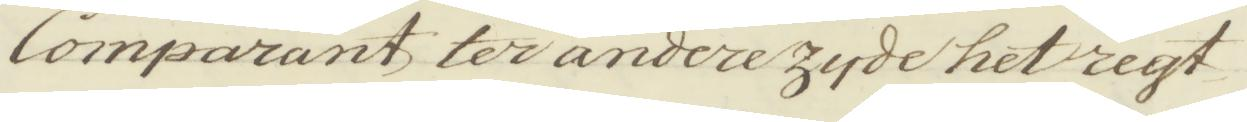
Comparant ter andere zyde het regt
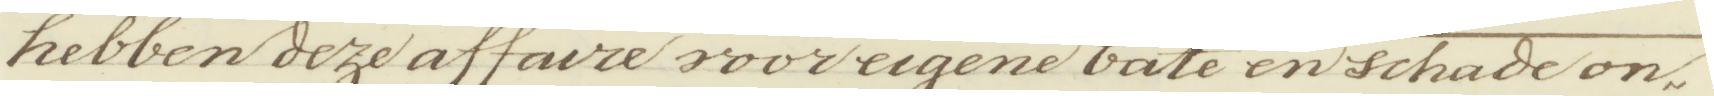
hebben deze affaire voor eigene bate en schade on„
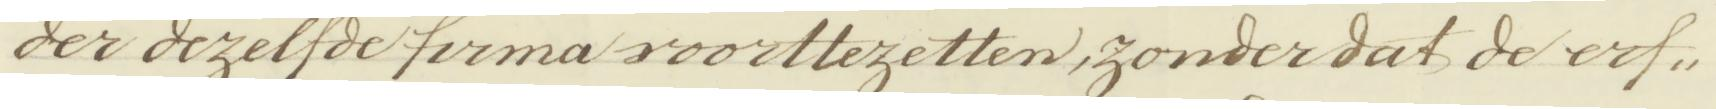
der dezelfde firma voorttezetten, zonder dat de erf„
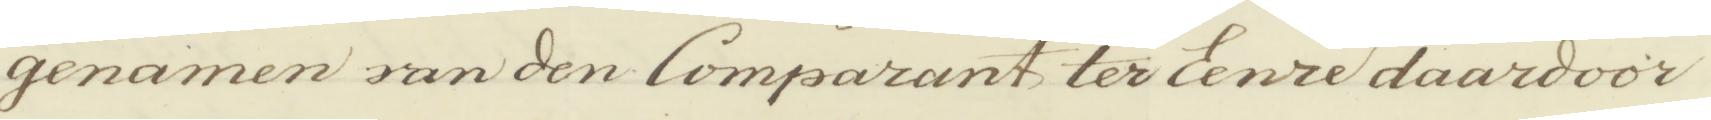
genamen van den Comparant ter Eenre daardoor
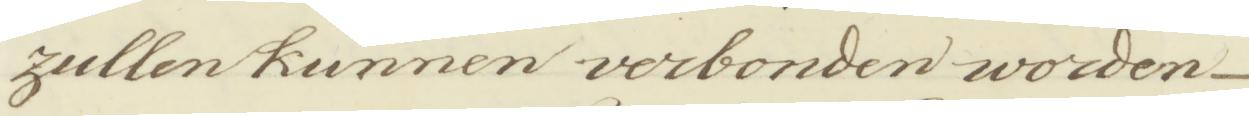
zullen kunnen verbonden worden-
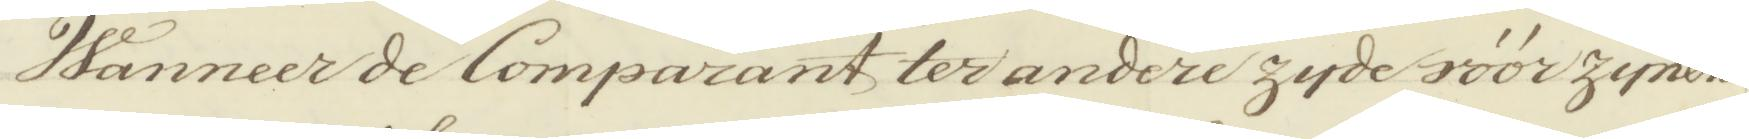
Wanneer de Comparant ter andere zyde vóór zynen
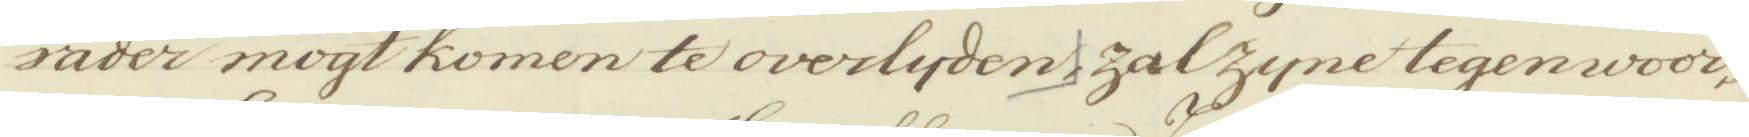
vader mogt komen te overlyden,/ zal zyne tegenwoor„
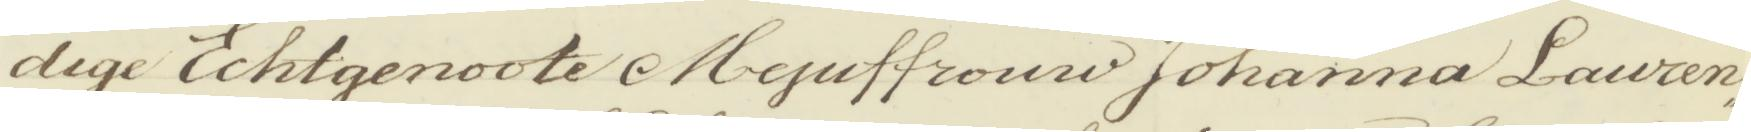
dige Echtgenoote Mejuffrouw Johanna Lauren„
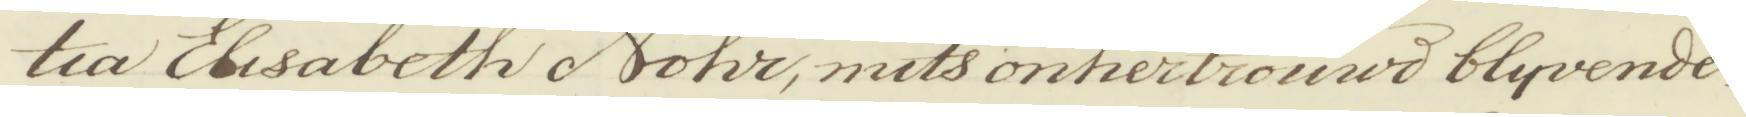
tia Elisabeth Nohr, mits onhertrouwd blyvende,
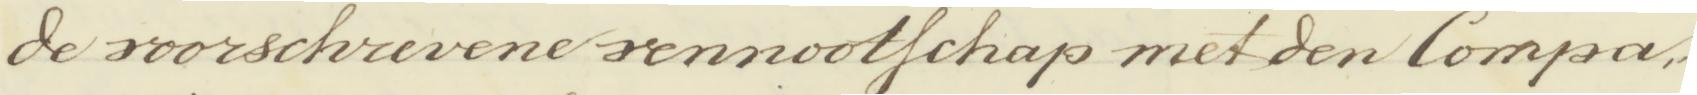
de voorschrevene vennootschap met den Compa„
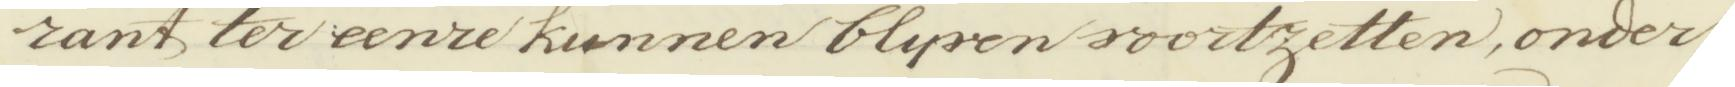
rant ter eenre kunnen blyven voortzetten, onder
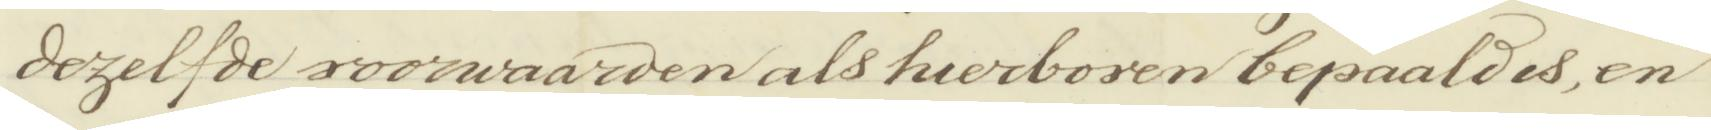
dezelfde voorwaarden als hierboven bepaald is, en
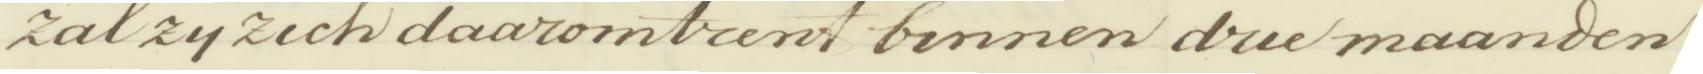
zal zy zich daaromtrent binnen drie maanden
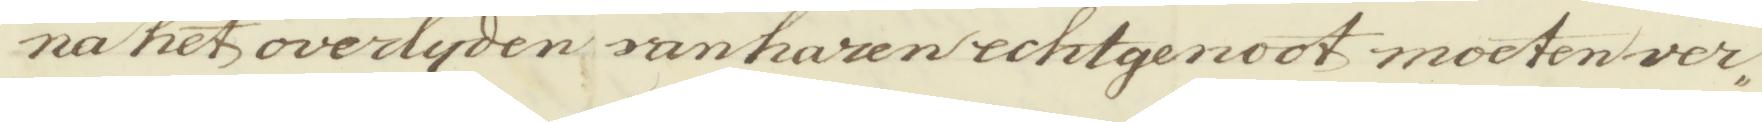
na het overlyden van haren echtgenoot moeten ver„
